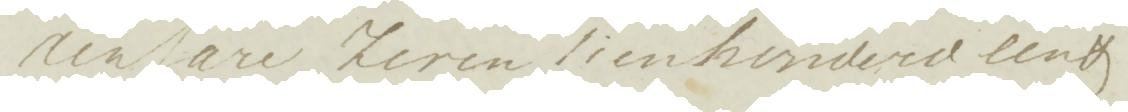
den Jare zeventienhonderd eenen
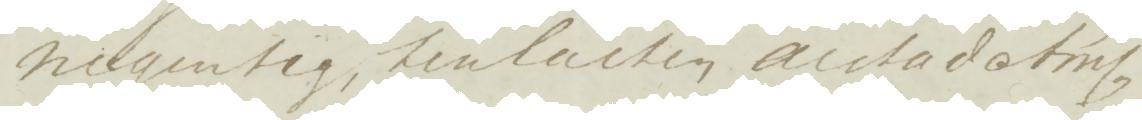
negentig, ten lasten de stad Ams
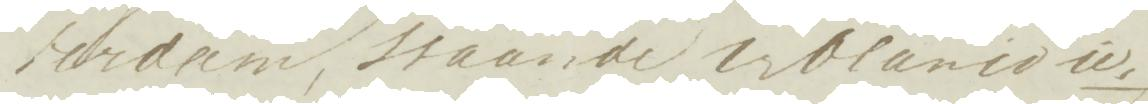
terdam, staande in blanco te,
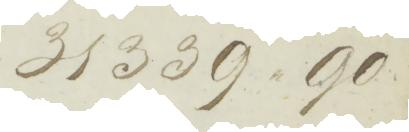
31339„90
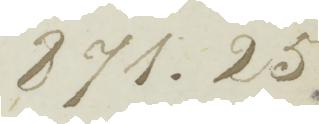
871. 25
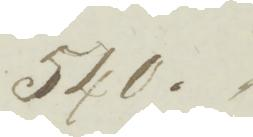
580. „
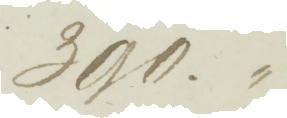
390. „
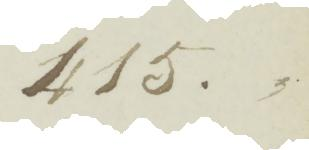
415. „
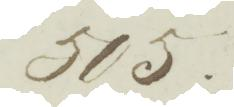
505.
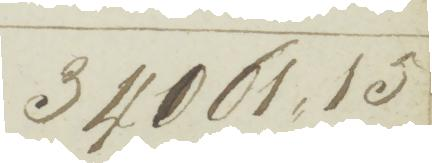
ƒ 34061,15
